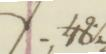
ƒ —, 48½
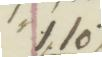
„ 1.10½
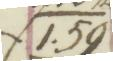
ƒ 1.59
